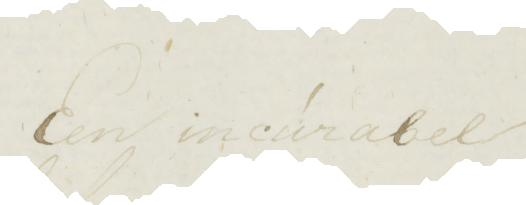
Een incurabel
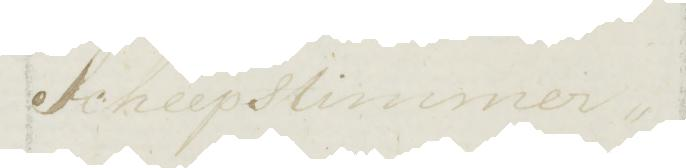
Scheepstimmer„
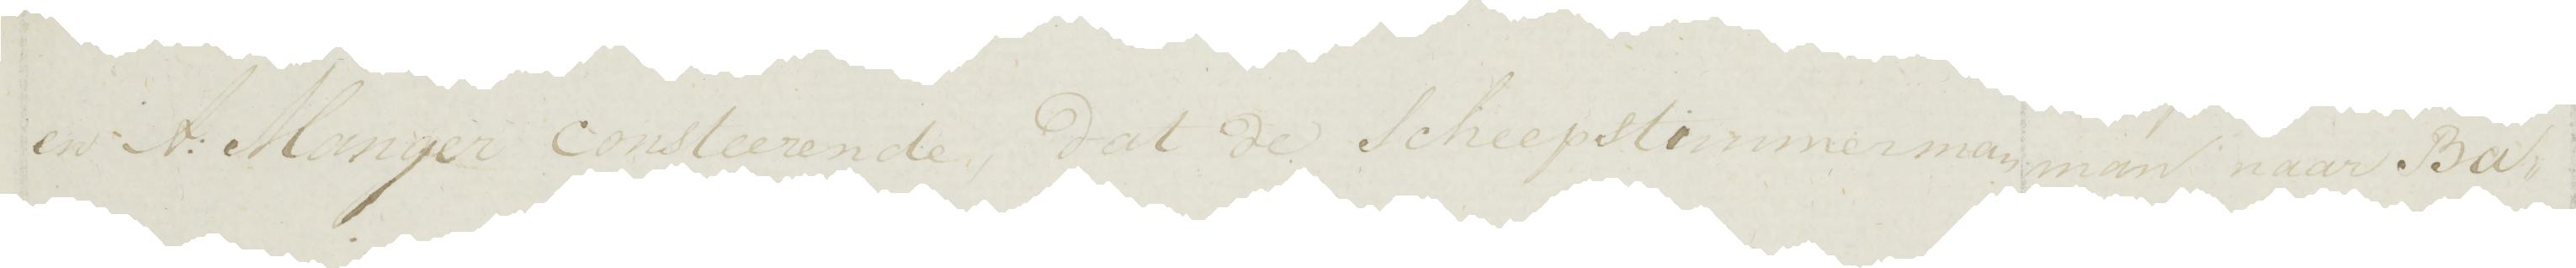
en A: Manger consteerende dat de scheepstimmerman „man naar Ba„
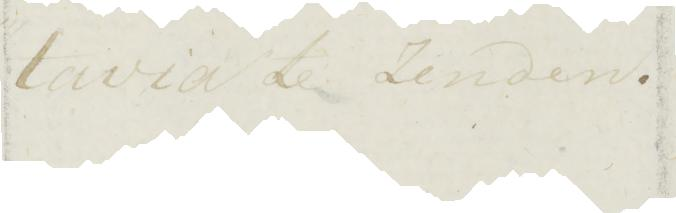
tavia te zenden.
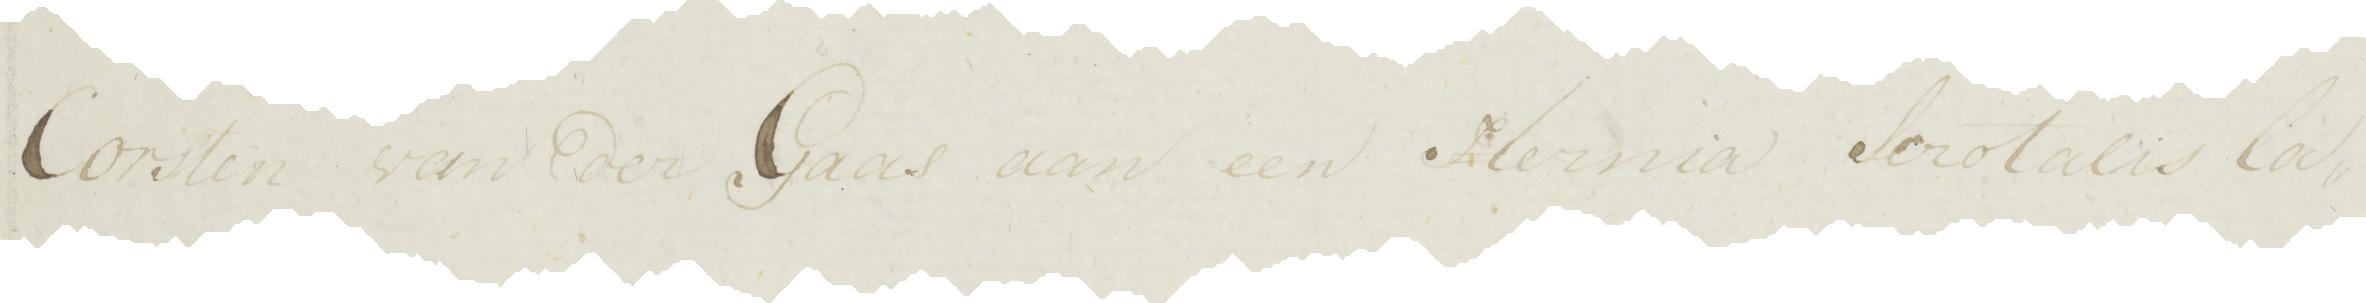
Corsten van der Gaas aan een Hernia Scrotalis la„
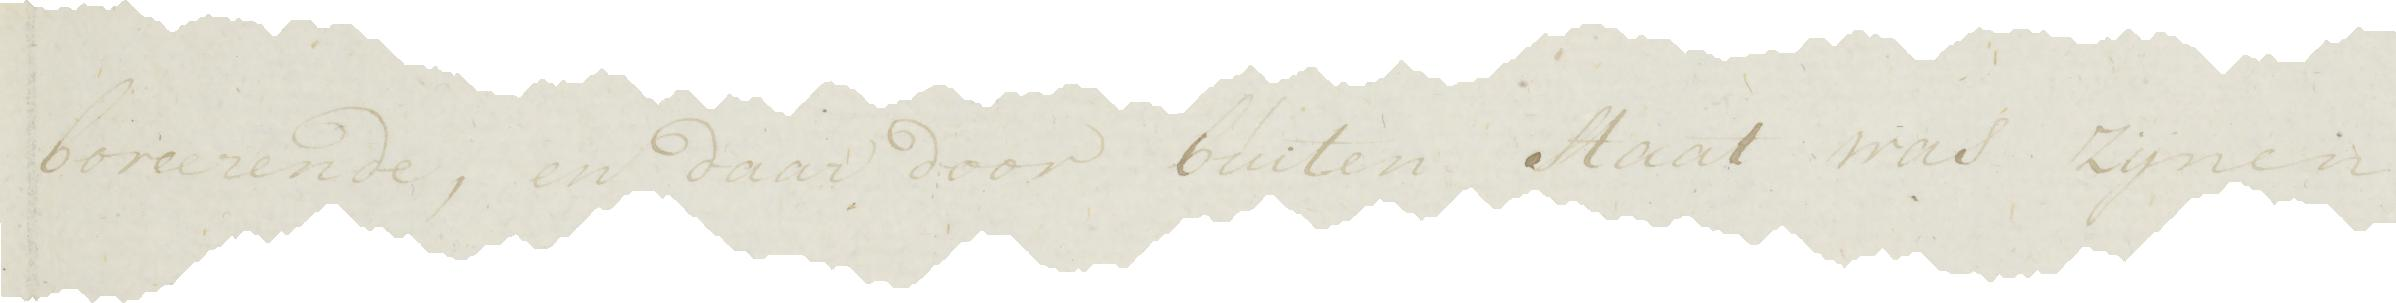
boreerende, en daar door buiten staat was zijnen
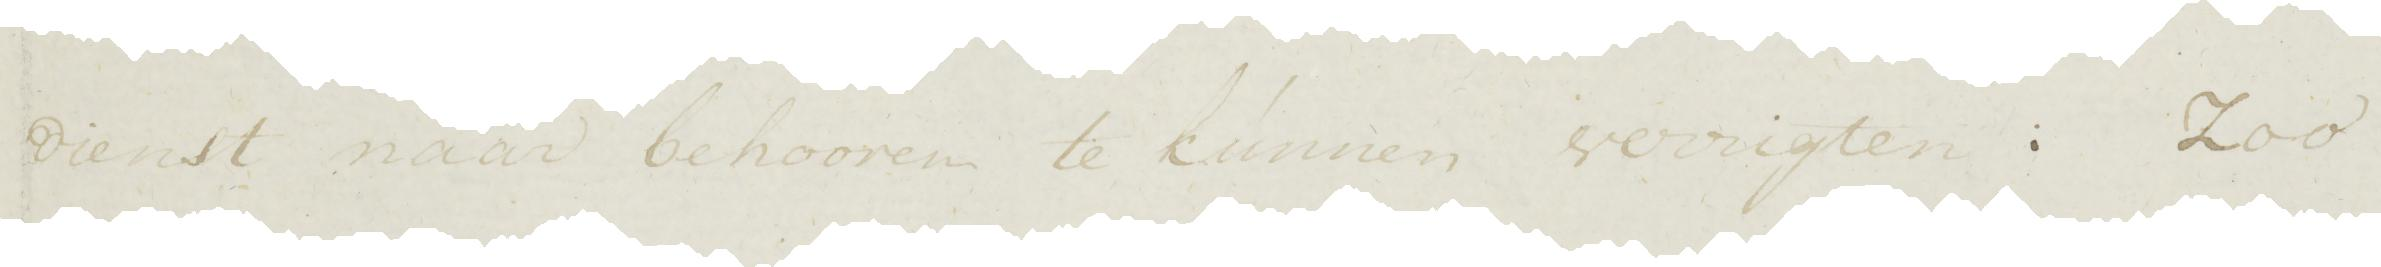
dienst naar behooren te kunnen verrigten: zoo
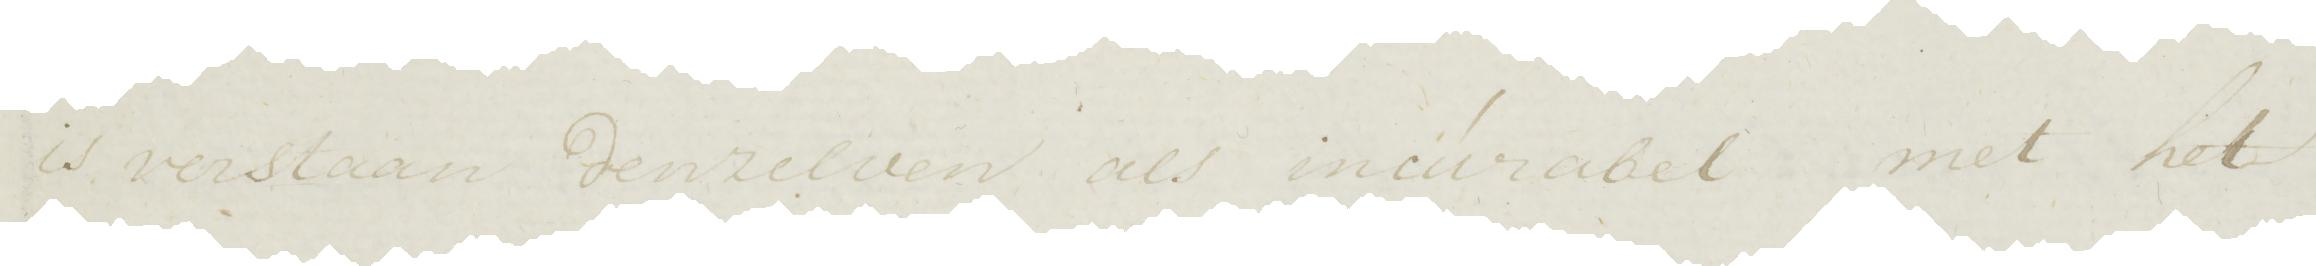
is verstaan denzelven als incurabel met het
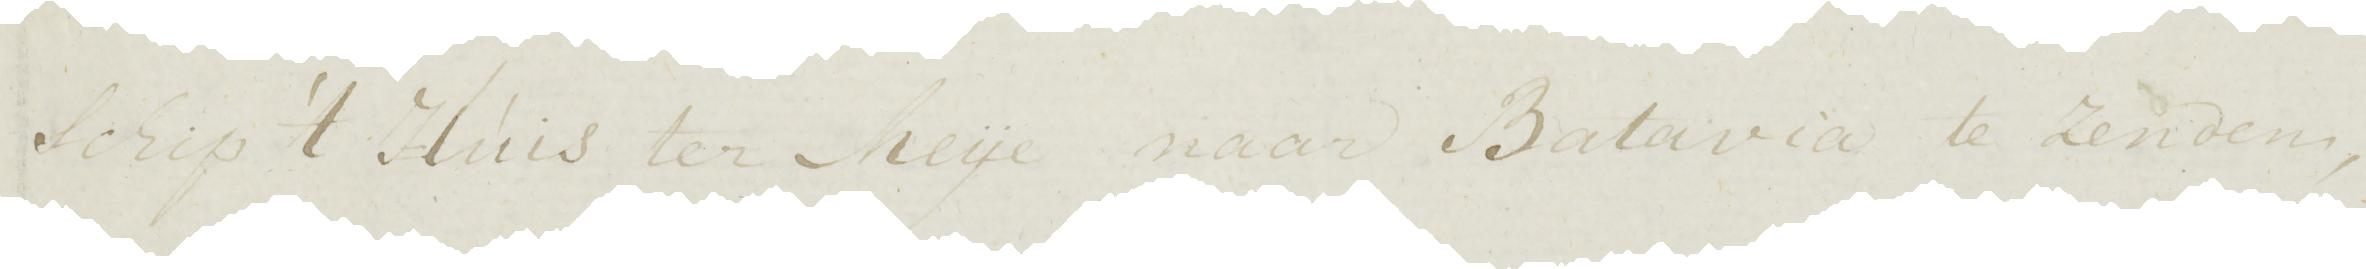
schip 't Huis ter heije naar Batavia te zenden,
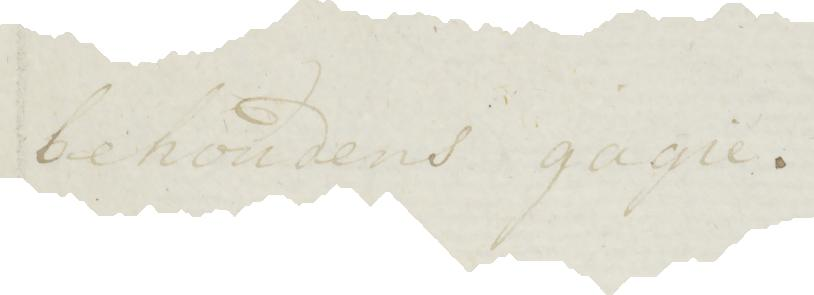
behoudens gagie.
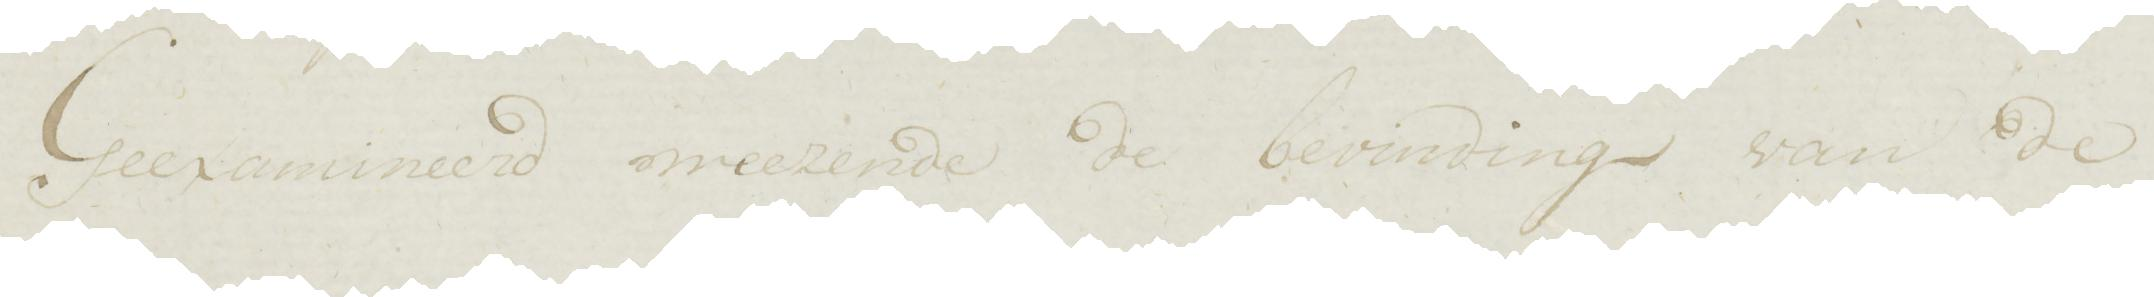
Geexamineerd weezende de bevinding van de
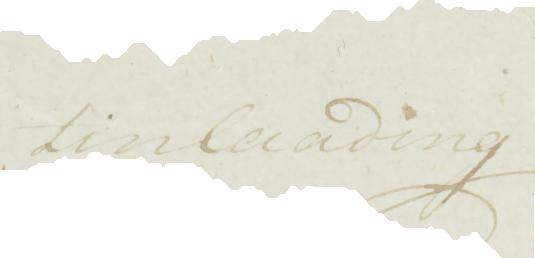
tinlaading
